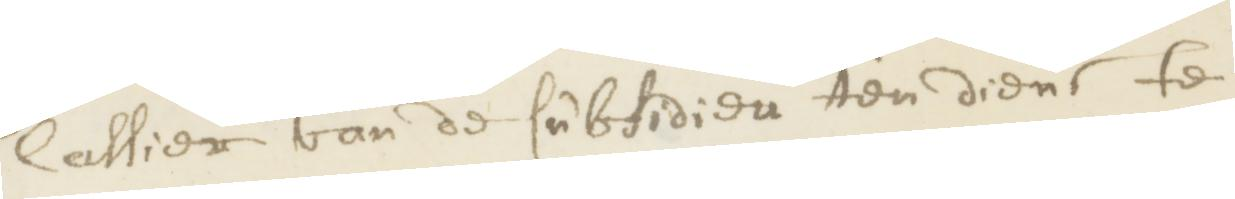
cassier van de subsidien ten dienste
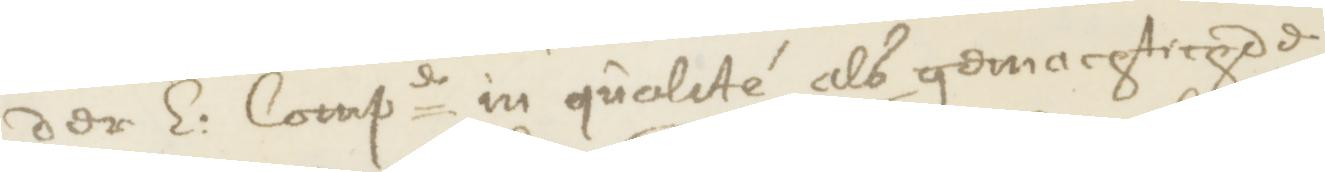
der E: Comp=e in qualité als gemachtichde
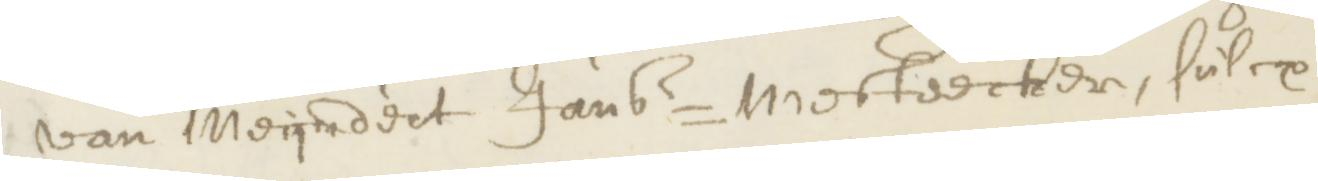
van Meijndert Jansz= Mesteecker, sulcx
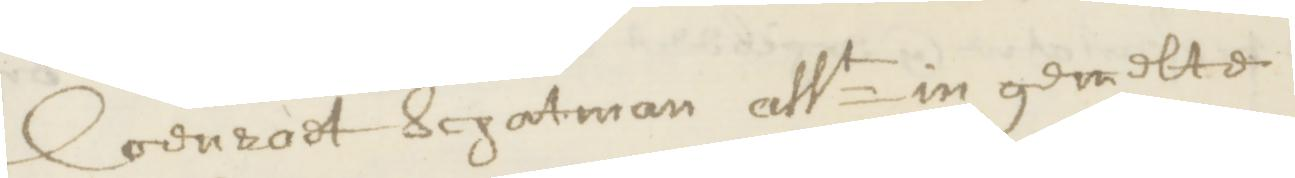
Coenraet Schatman ass=t in gemelte
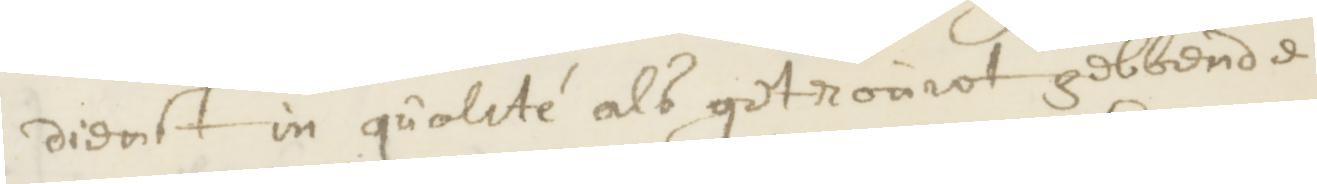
dienst in qualité als getrouwt hebbende
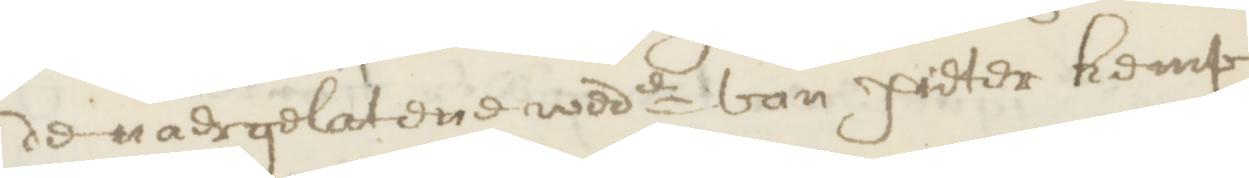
de naegelatene wed=e van Pieter kemp
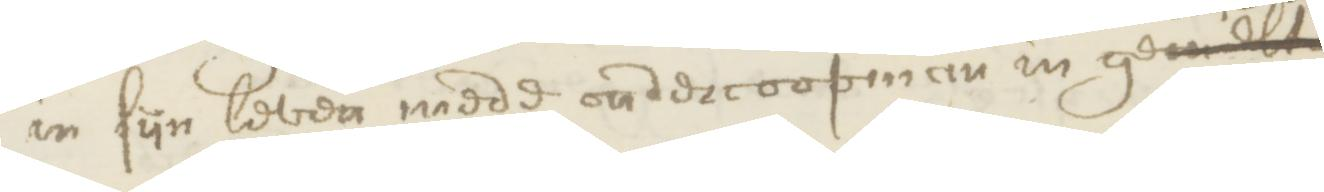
in sijn leven mede ondercoopman in gemelte
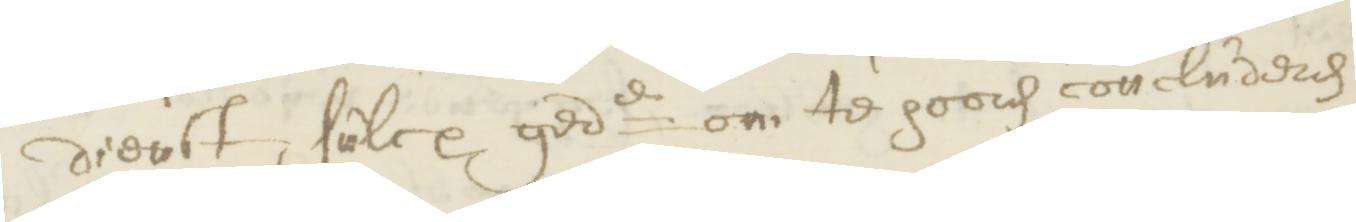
dienst, sulcx ged=e om te hooren concluderen
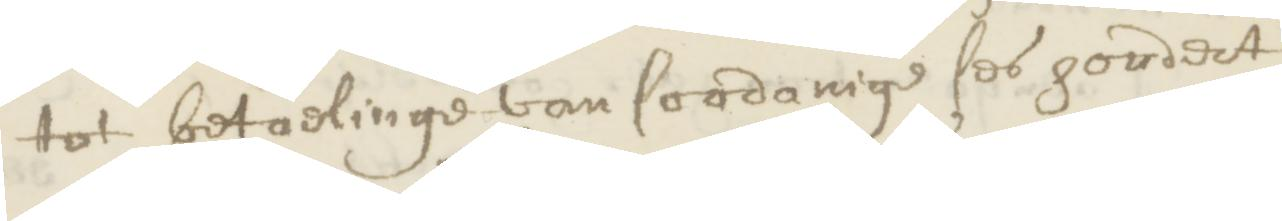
tot betaelinge van soodanige ses hondert
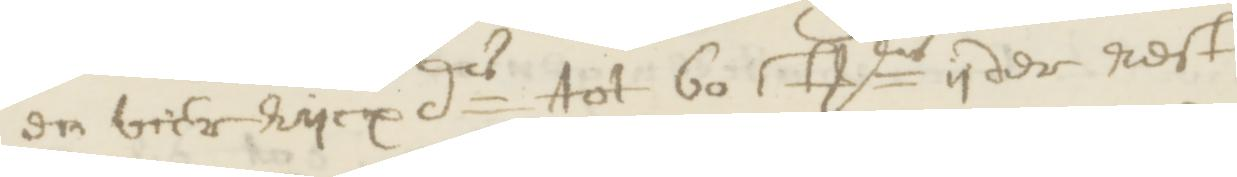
en vier rijcxd=s tot 60 stver=s ijder rest
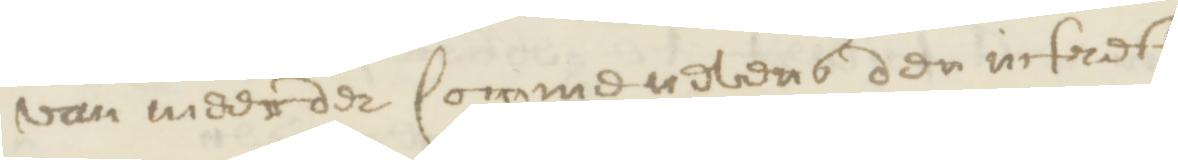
van meerder somme nevens den intrest
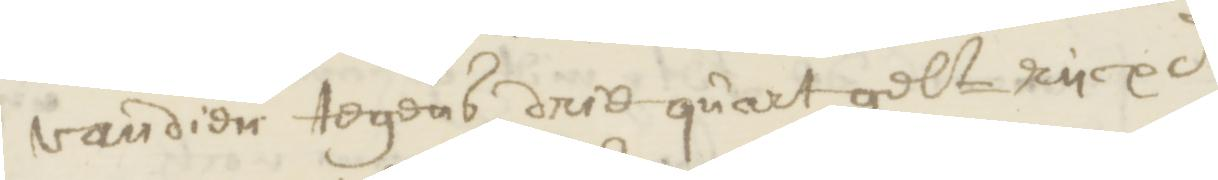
vandien tegens drie quart gelt rijcxd=s
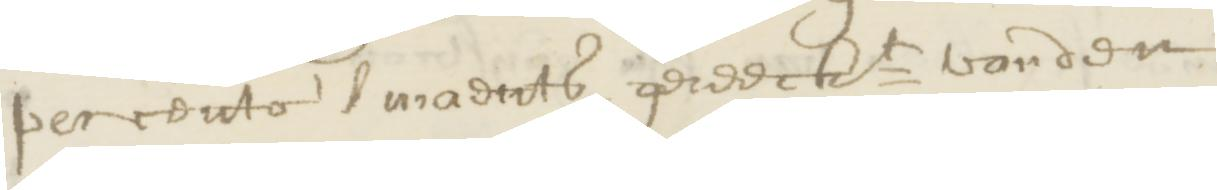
percento 's maents gereeck=t van den
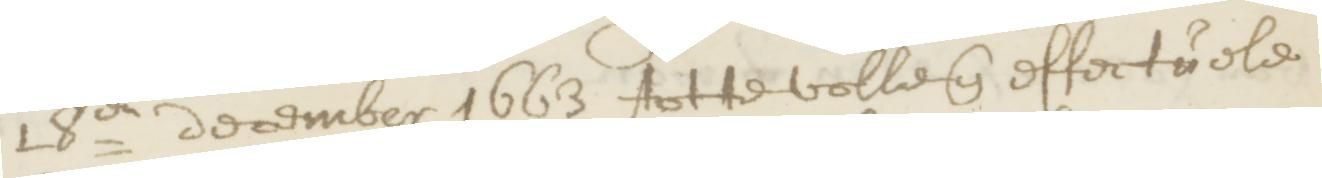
18=en december 1663 tot te volle ende effectuele
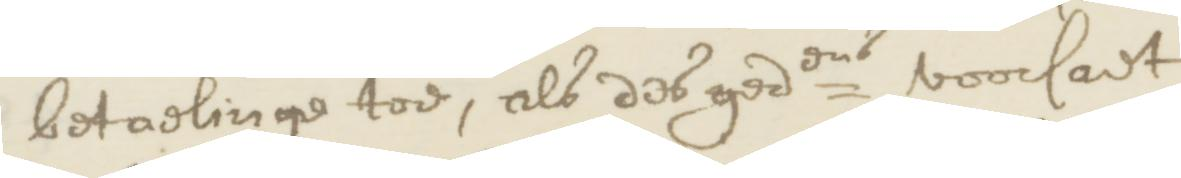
betaelinge toe, als des ged=ens voorsaet
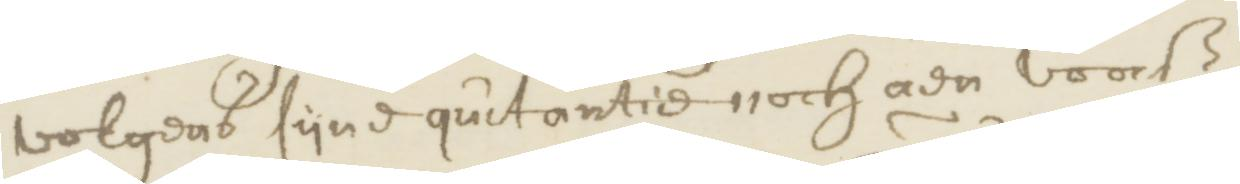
volgens sijne quitantie noch aen voorsz
